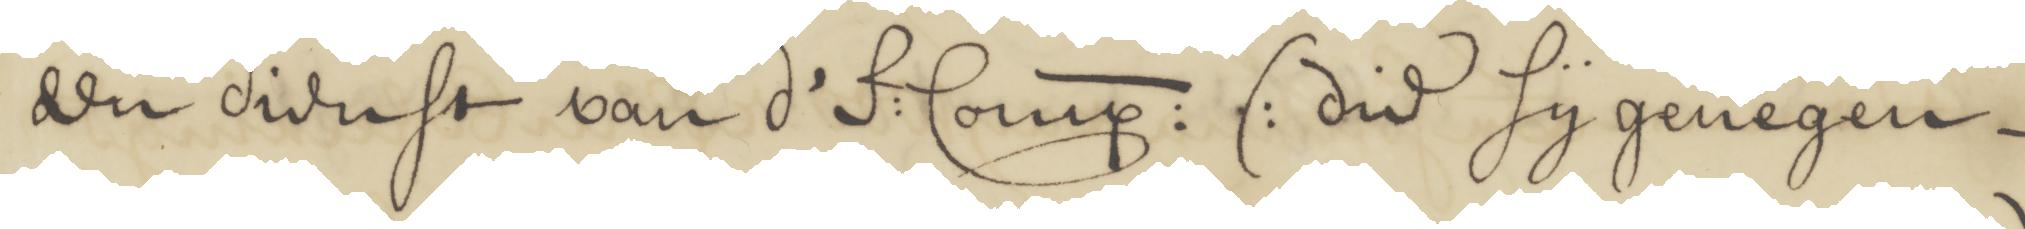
den dienst van d’ E: Comp: (:die sij genegen
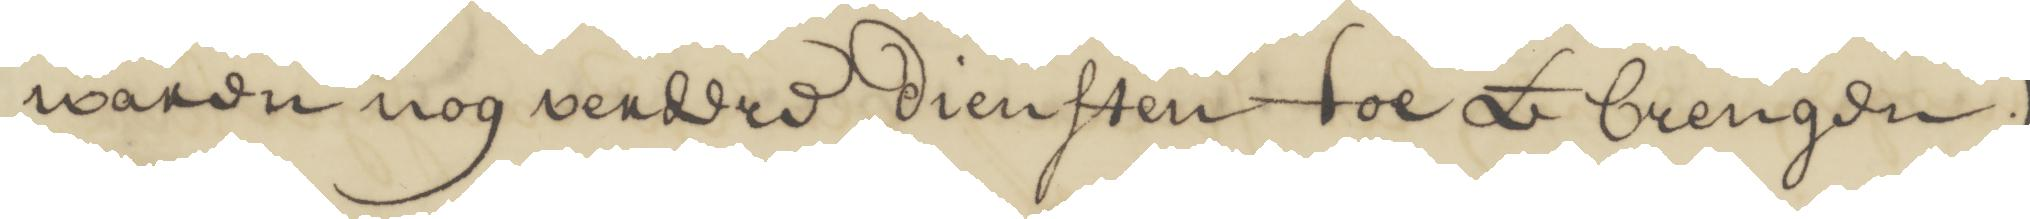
waren nog verdere diensten toe te brengen:
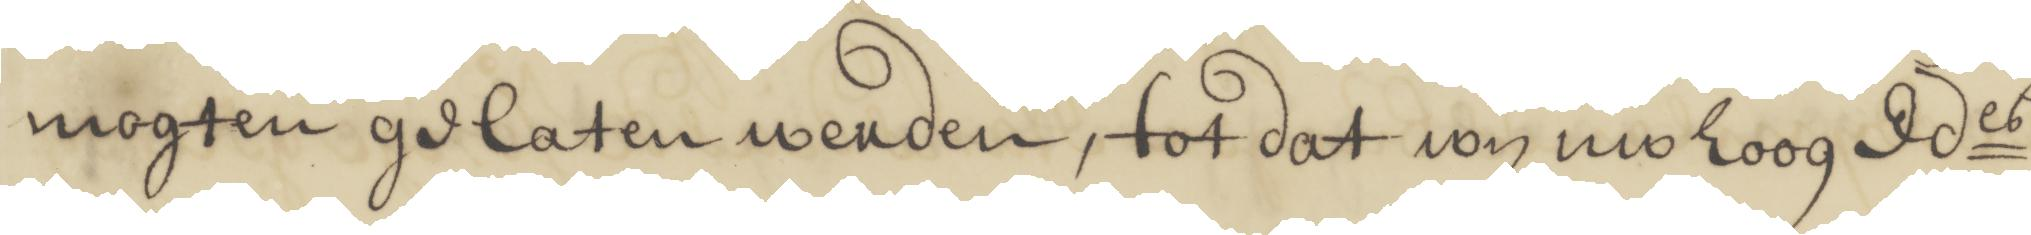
mogten gelaten werden, tot dat wij uw hoog Ed=ls
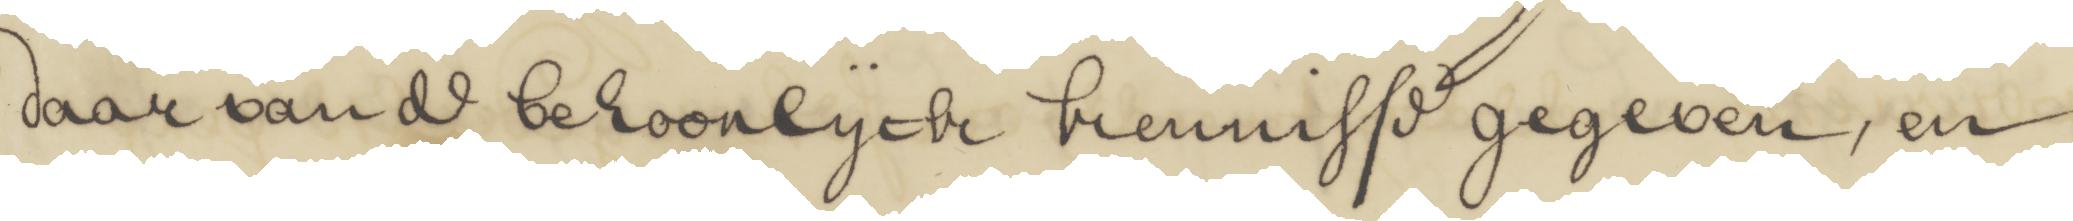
daar van de behoorlijck kennisse gegeven, en
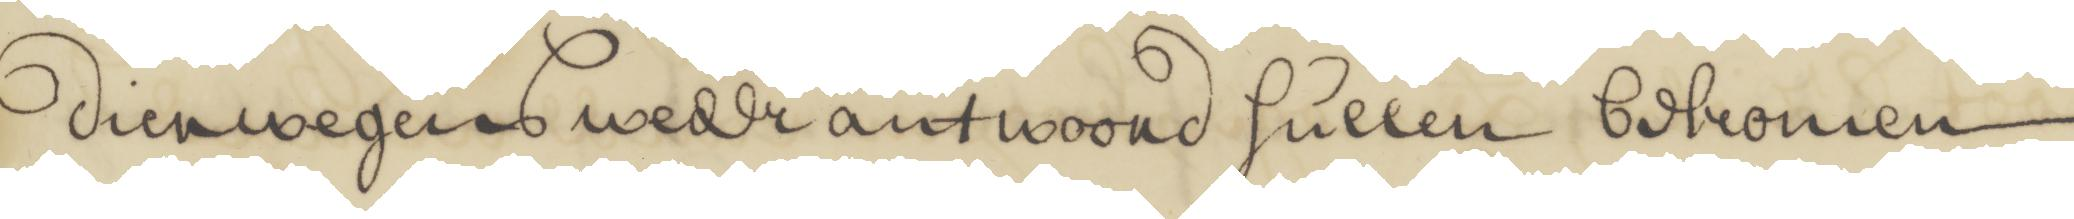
dierwegens weder antwoord sullen bekomen
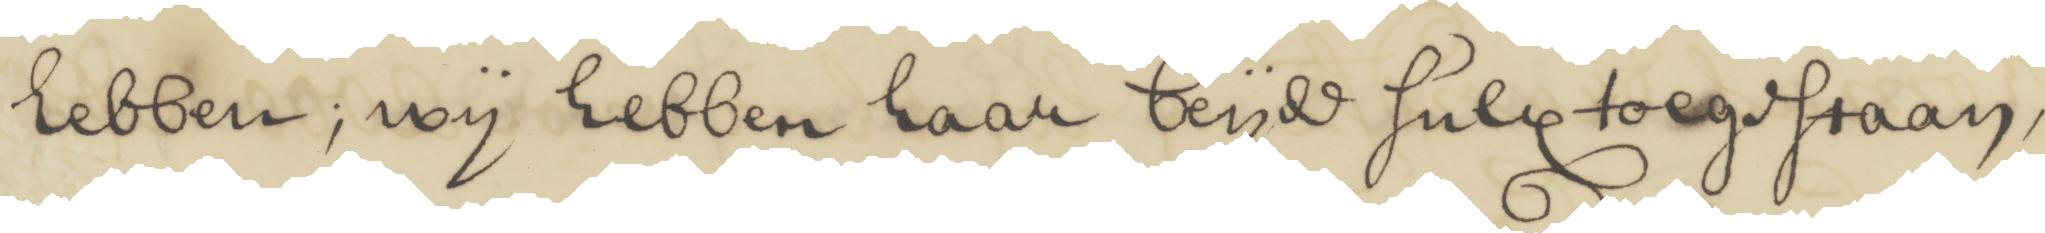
hebben; wij hebben haar beijde sulx toegestaan
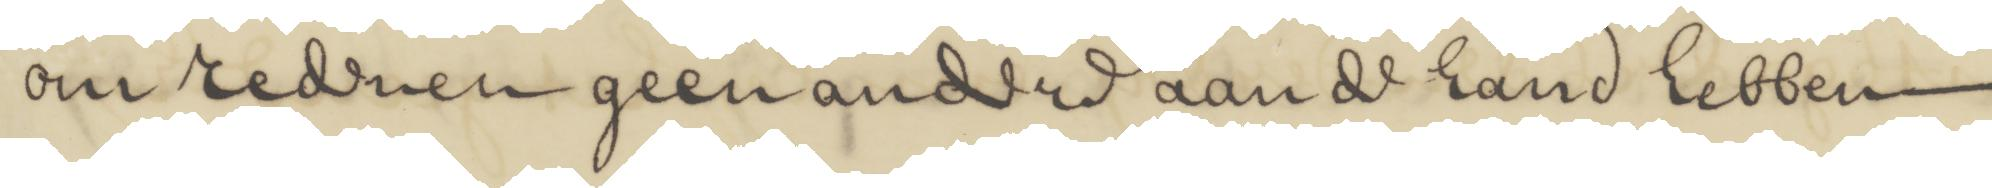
om redenen geen andere aan de hand hebben
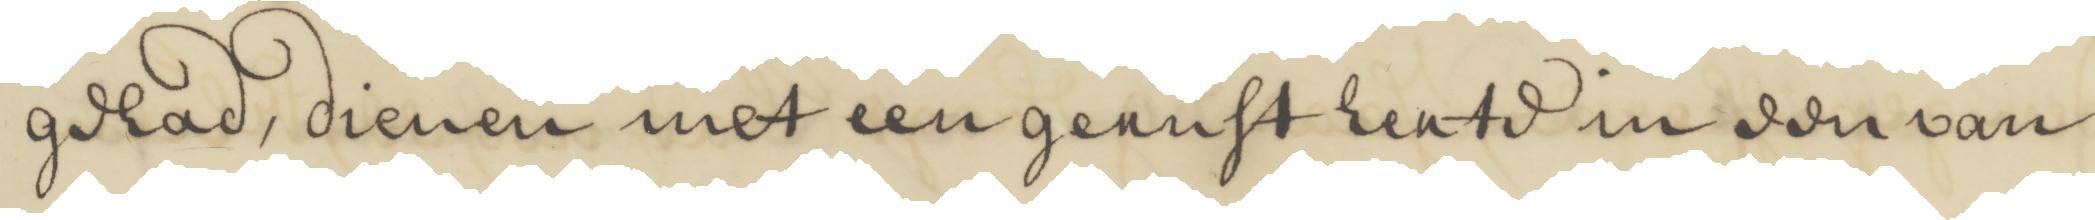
gehad, dienen met een gerust herte in een van
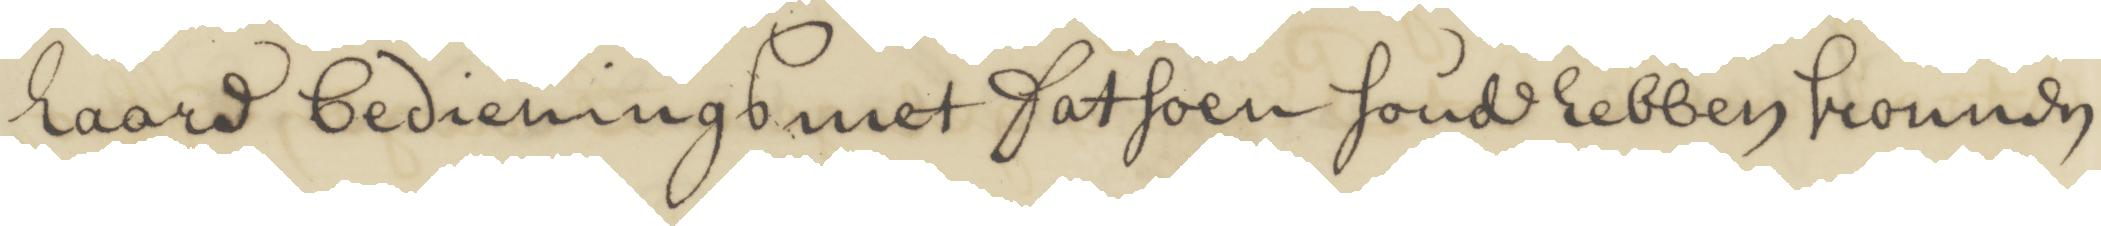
haare bedienings met fatsoen soude hebben konnen
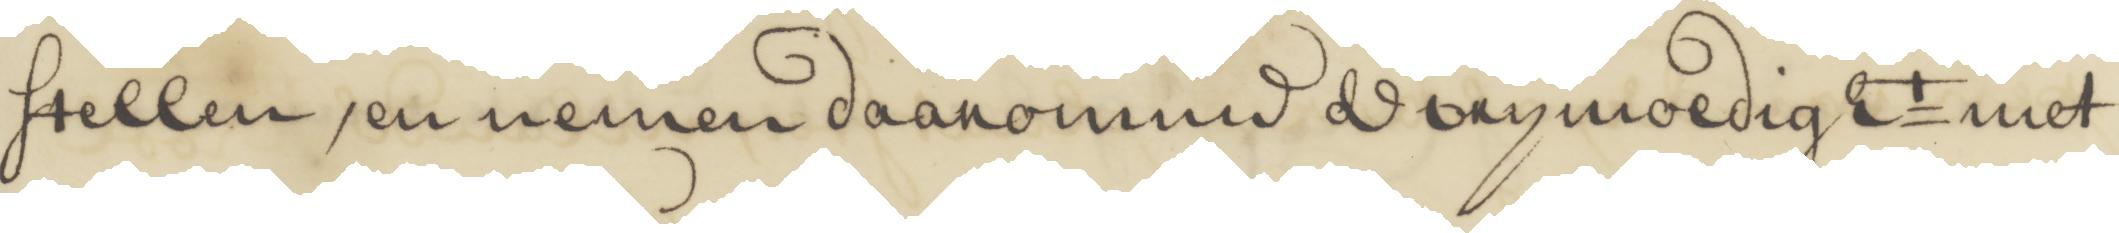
stellen, en nemen daaromme de vrijmoedigh=t met
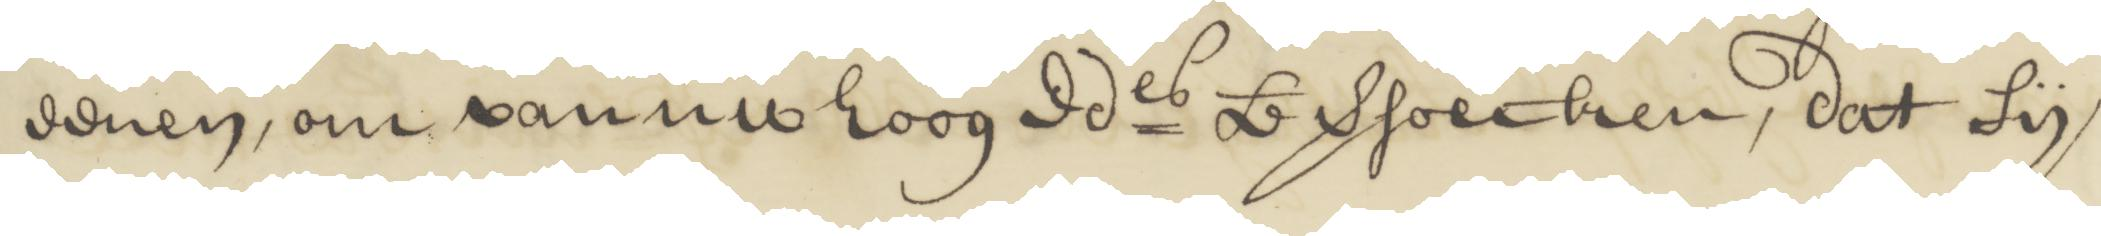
eenen, om van uw hoog Ed=ls te versoecken, dat sij
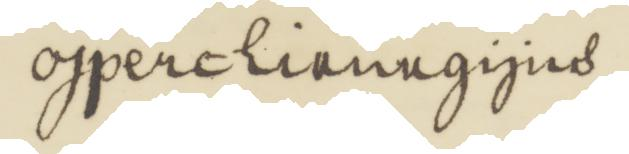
opperchirurgijns
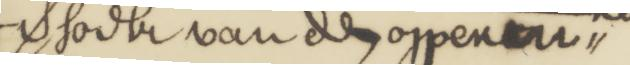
't versoek van den opperen„rs
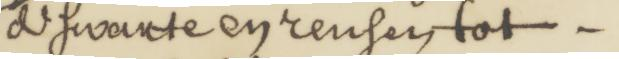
de swarte en rensen tot -
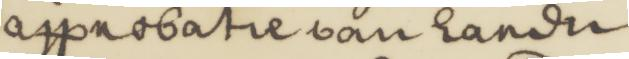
approbatie van haren
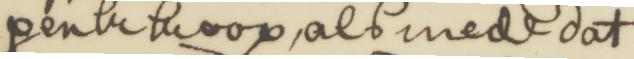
perk koop, als mede dat
